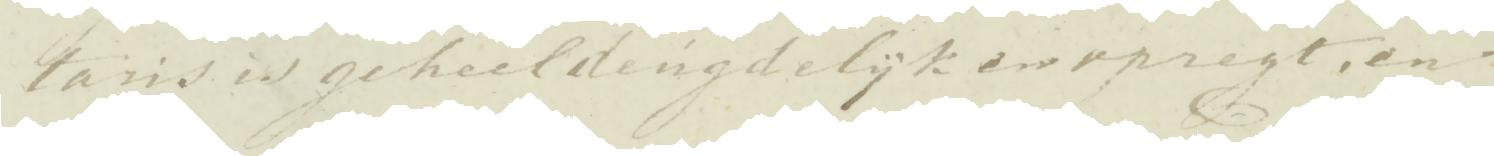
taris is geheel deugdelijk en opregt, en
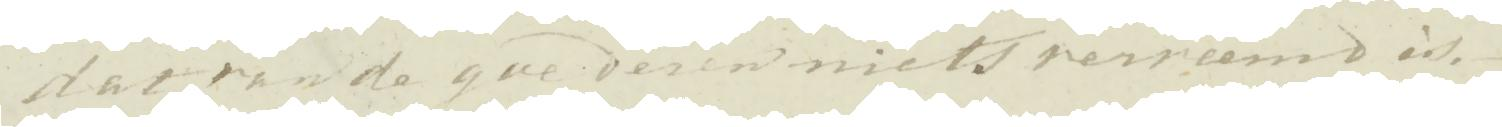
dat van de goederen niets verveemd is.
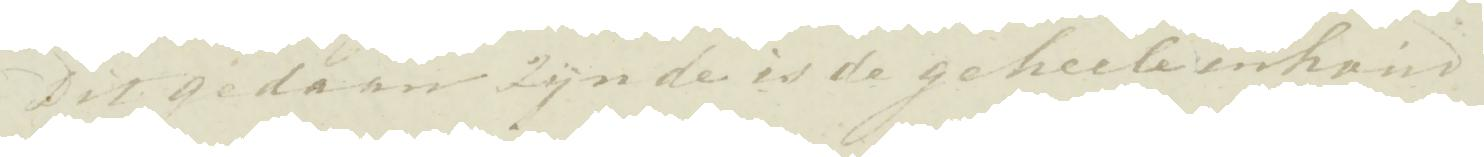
Dit gedaan zijnde is de geheele inhoud
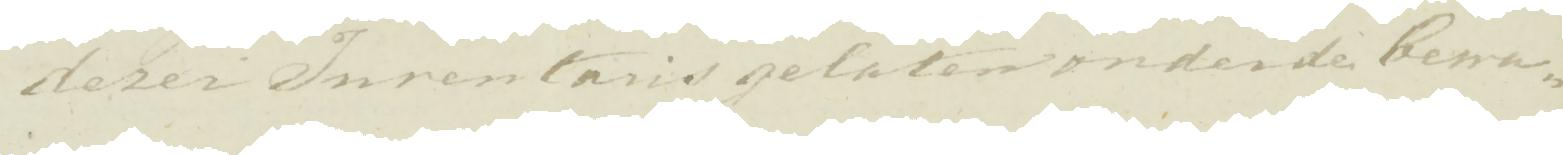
dezer Inventaris gelaten onder de bewa,
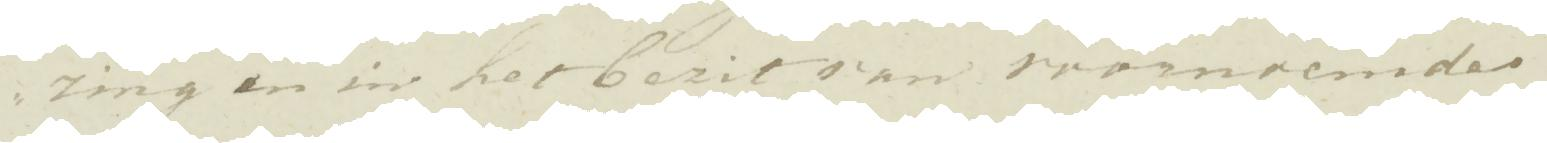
„ ring en in het bezit van voornoemde
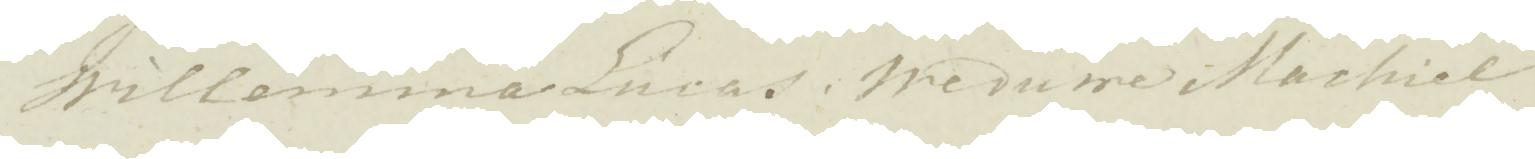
Willemina Lucas, weduwe Machiel
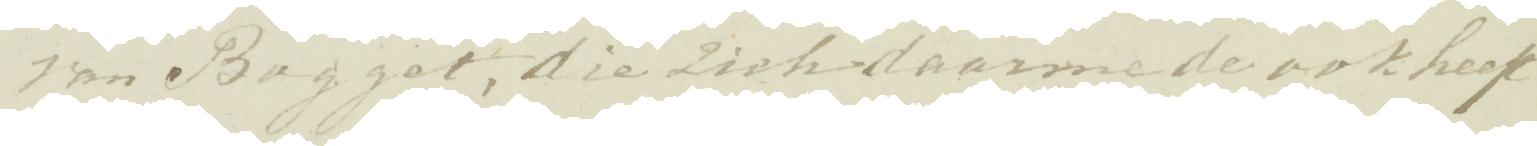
van Bogget, die zich daarmede ook heeft
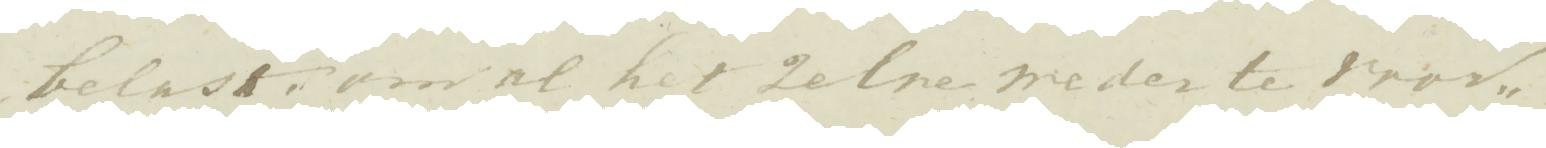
belast„ om al het zelve weder te voor„
